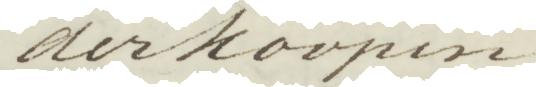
der koopen
